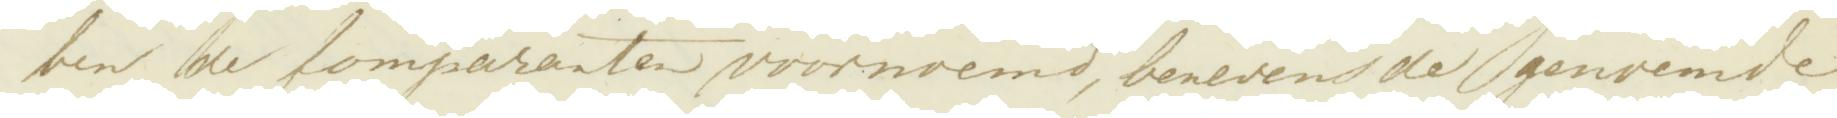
ben de Comparanten voornoemd, benevens de genoemde
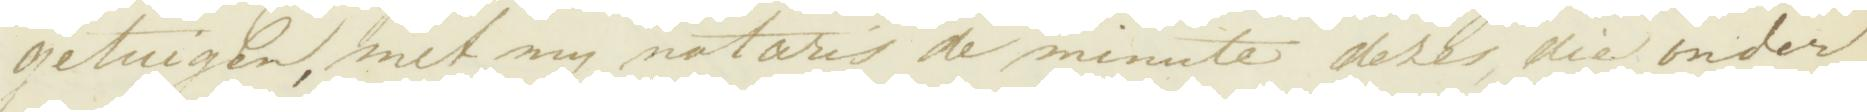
getuigen, met my notaris de minute dezes, die onder
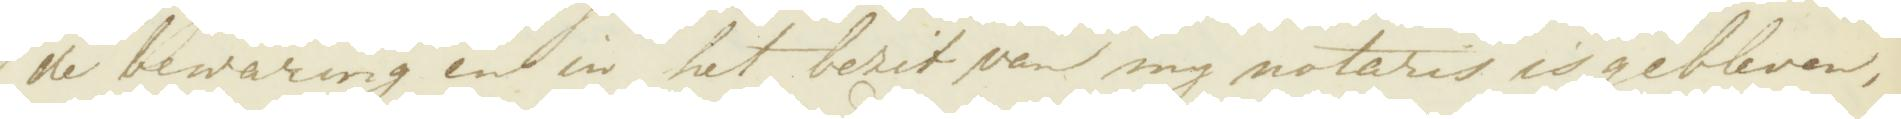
de bewaring en in het bezit van my notaris is gebleven,
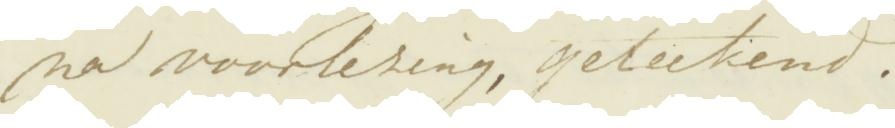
na voorlezing, geteekend
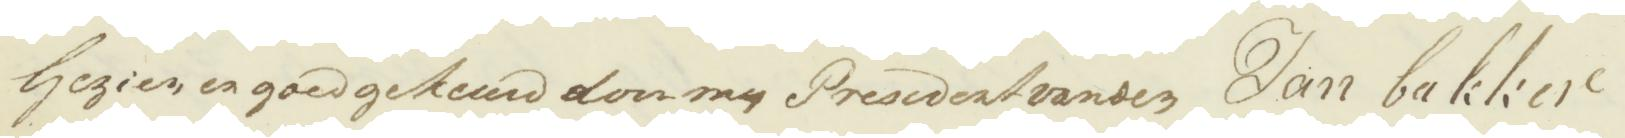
Gezien en goedgekeurd door my President van den Ian bakker
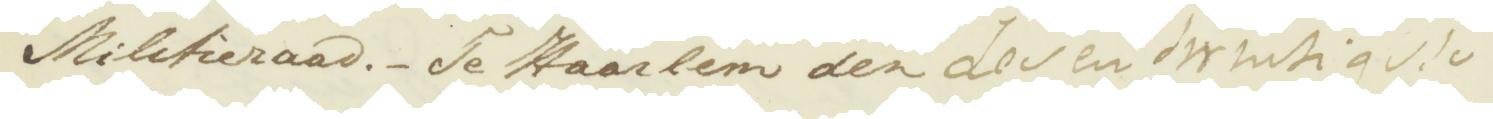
Militieraad. – Te Haarlem den Zes en twintigste
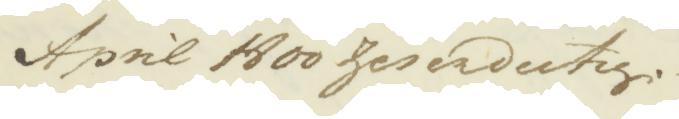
April 1800 Zes en dertig.
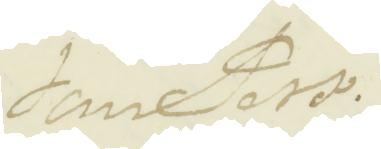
van Pets.
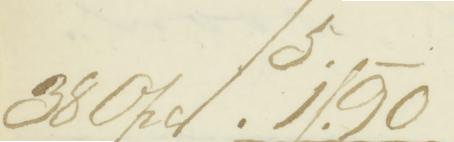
38 Opct. 5 1.90
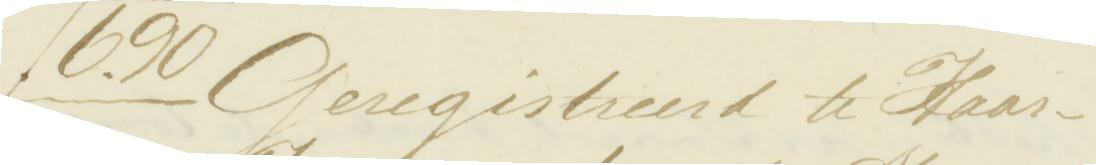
ƒ6.90 Geregistreerd te Haar-
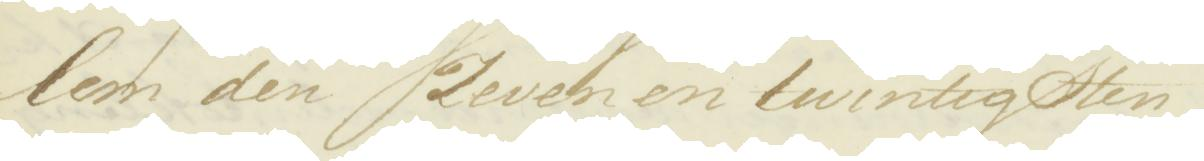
lem den Zeven en twintigsten
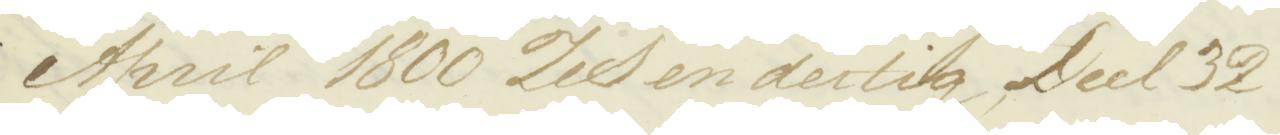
April 1800 zes en dertig, Deel 32
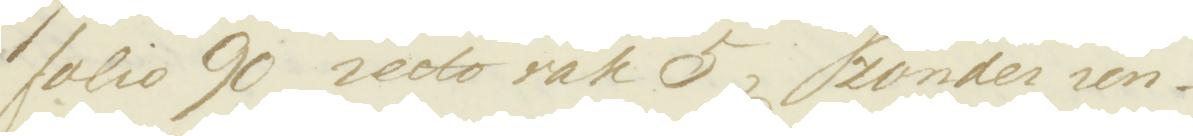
folio 90 recto vak 5, zonder ren-
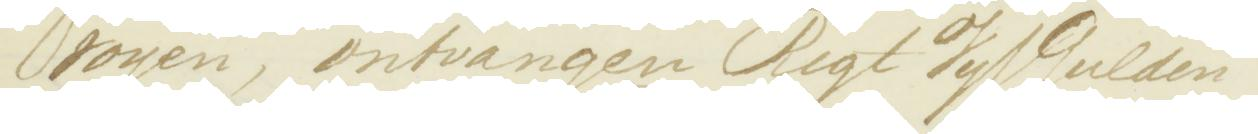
voyen, ontvangen Regt vyf Gulden
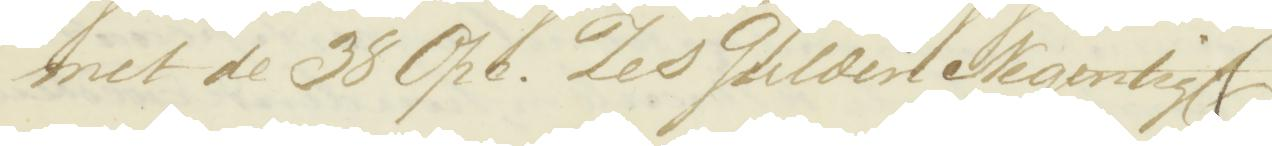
met de 38 Opc. Zes Gulden Negentig
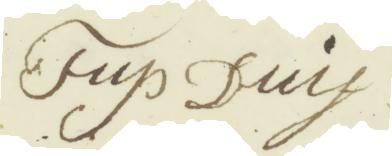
Fup Duif
